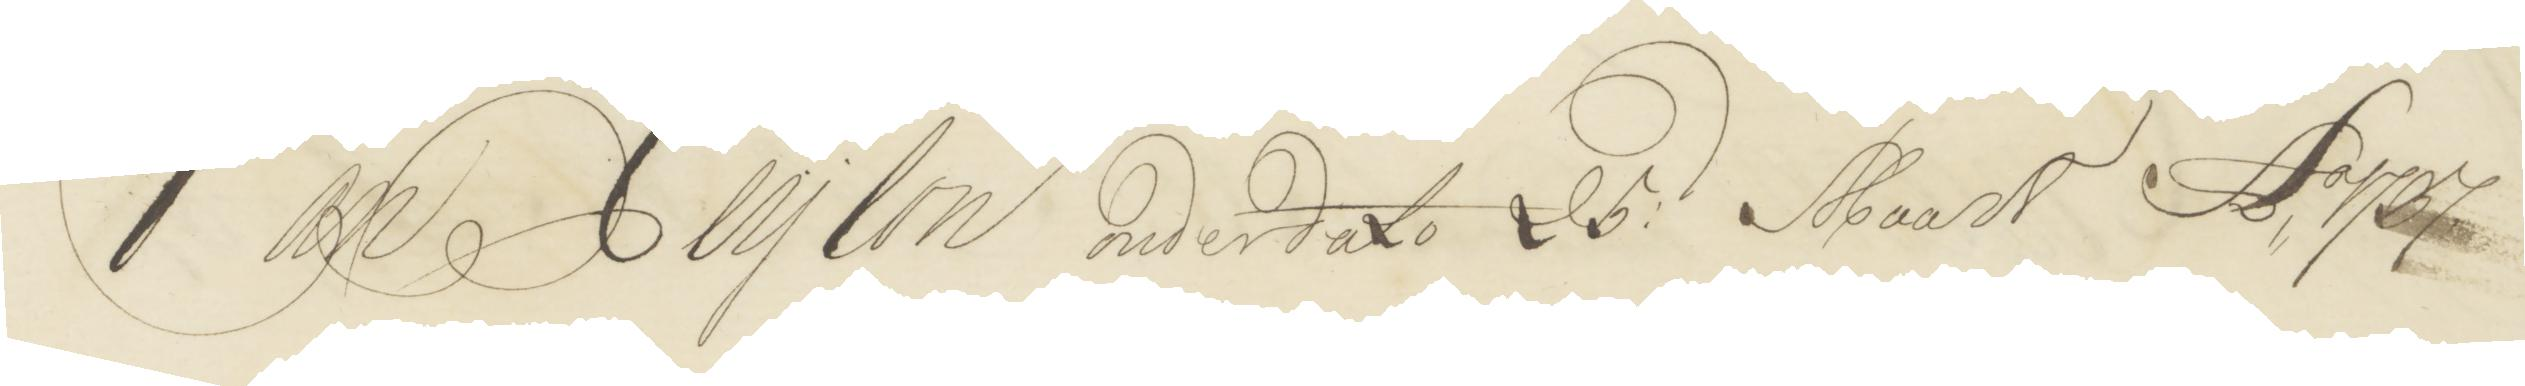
Van Ceijlon onderdato 25:' Maart A„o 1737
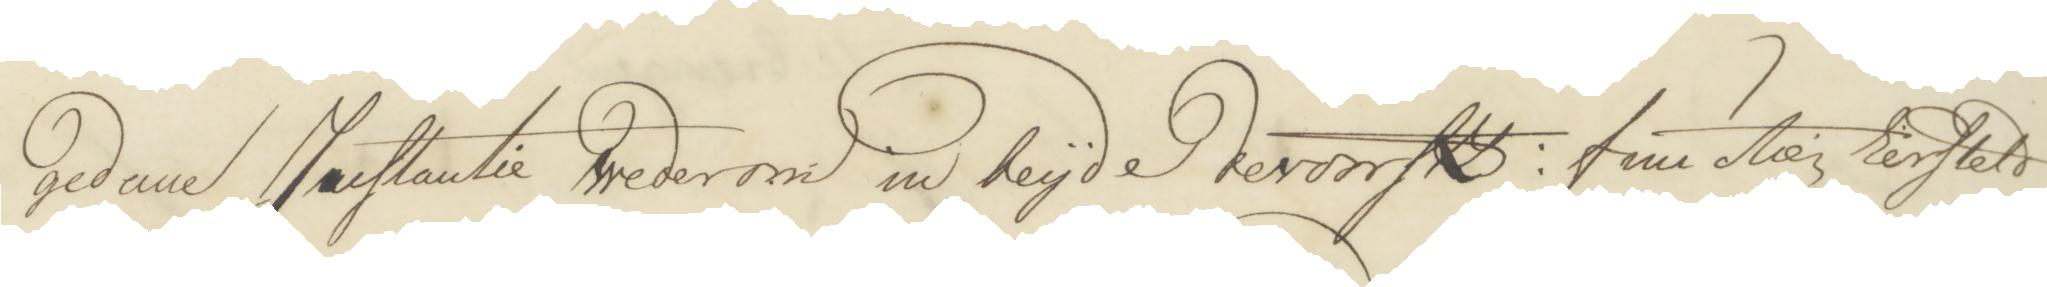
gedane Jnstantie wederom in beijde devoorsz: functien hersteld
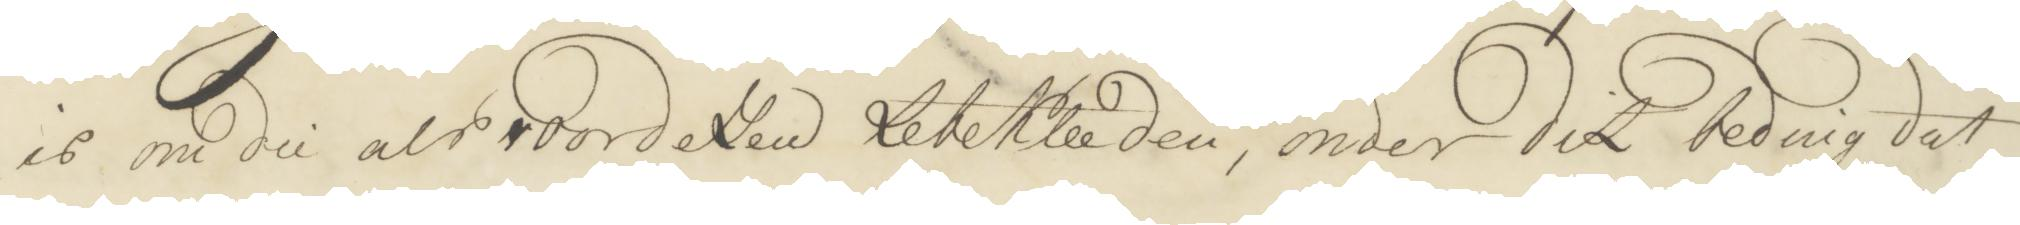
is om die als voordezen tebekleeden, onder dit beding dat
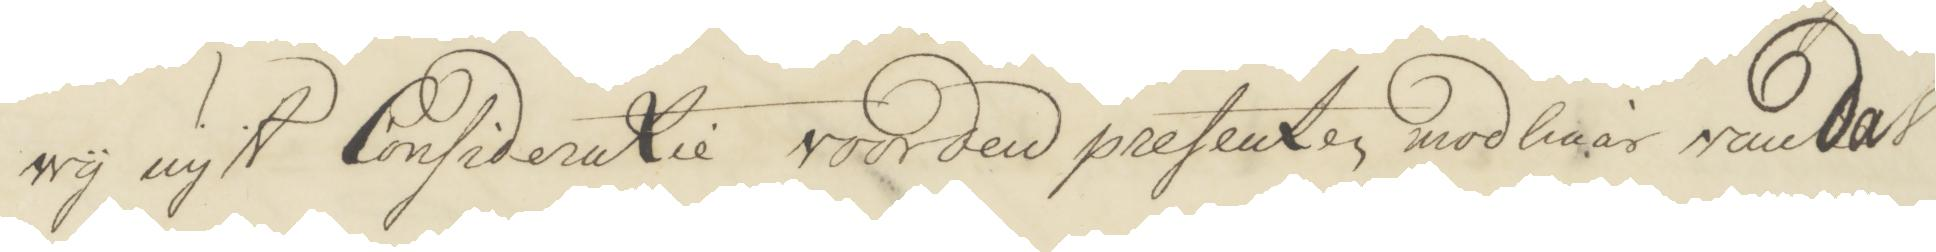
wij uijt Consideratie voor den presenten modliaar van dat
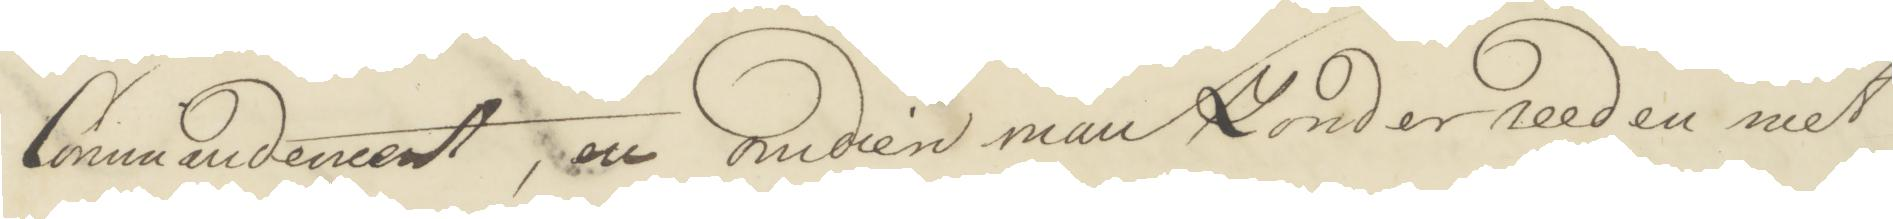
Commandement, en omdien man zonder reeden niet
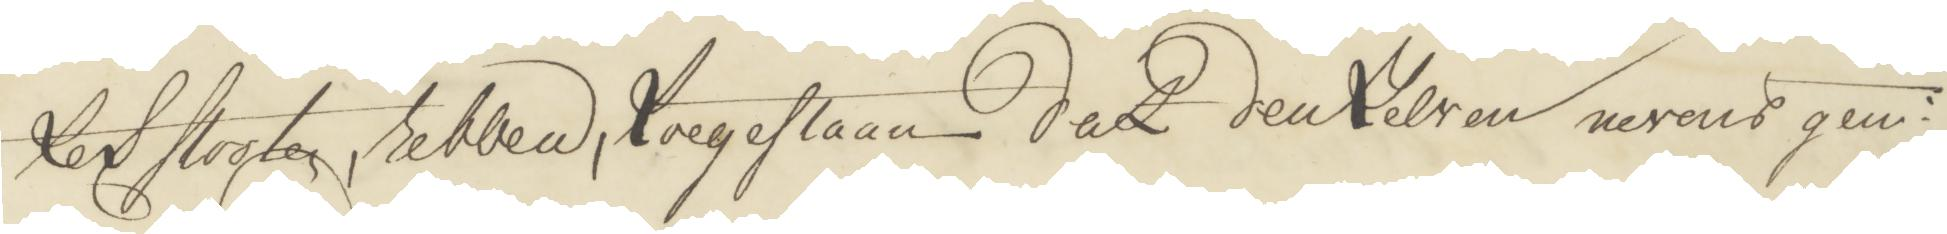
teverstooten, hebben, toegestaan dat denzelven nevens gem:
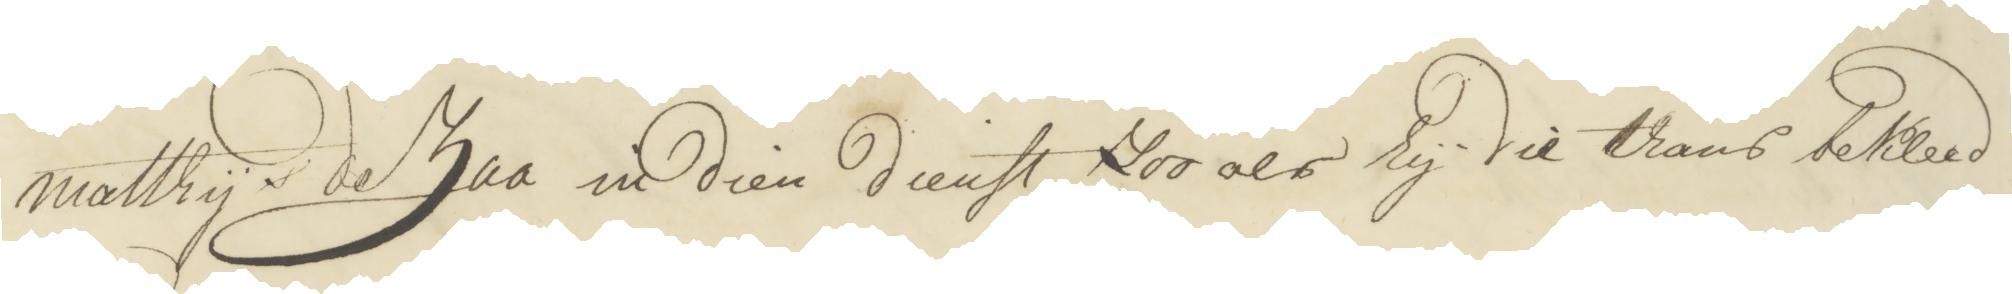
matthijs de Zaa in dien dienst zoo als hij die thans bekleed
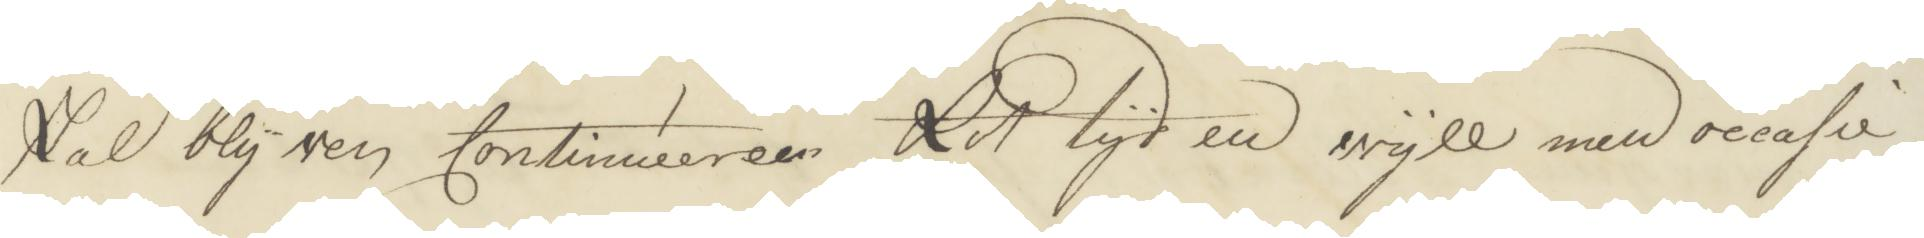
zal blijven Continueeren tot tijd en wijle men occasie
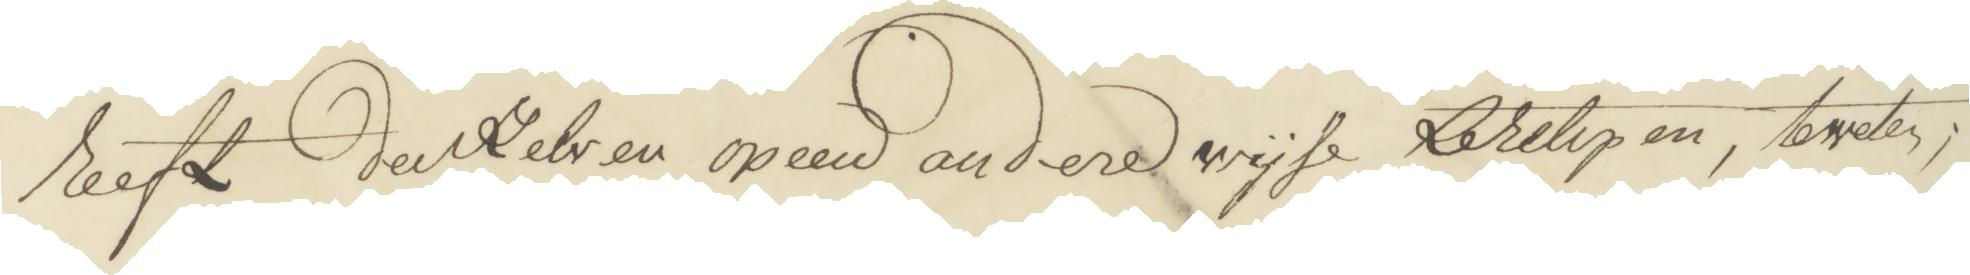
heeft denzelven op een andere wijse tehelip en, teweten;
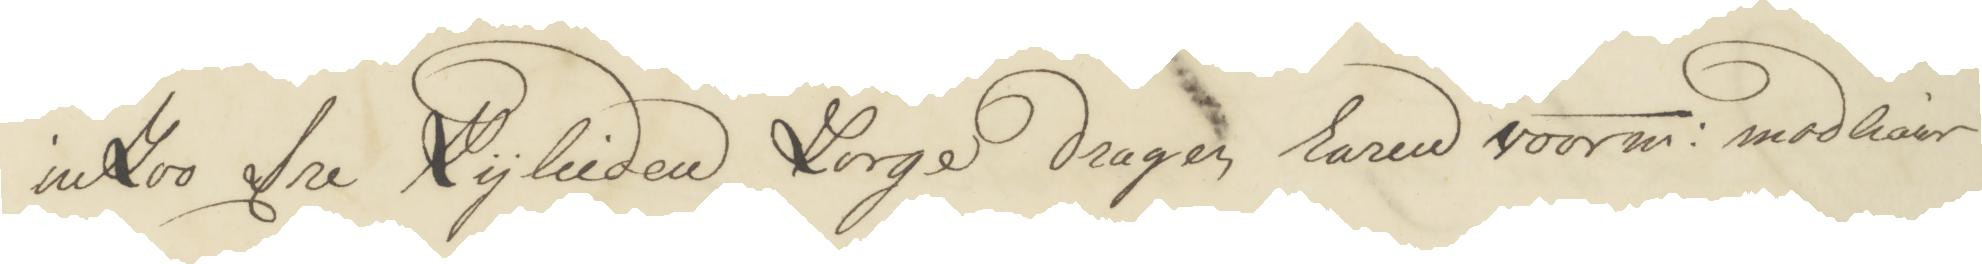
in zoo verre zijlieden zorge dragen haren voorm: modliaar
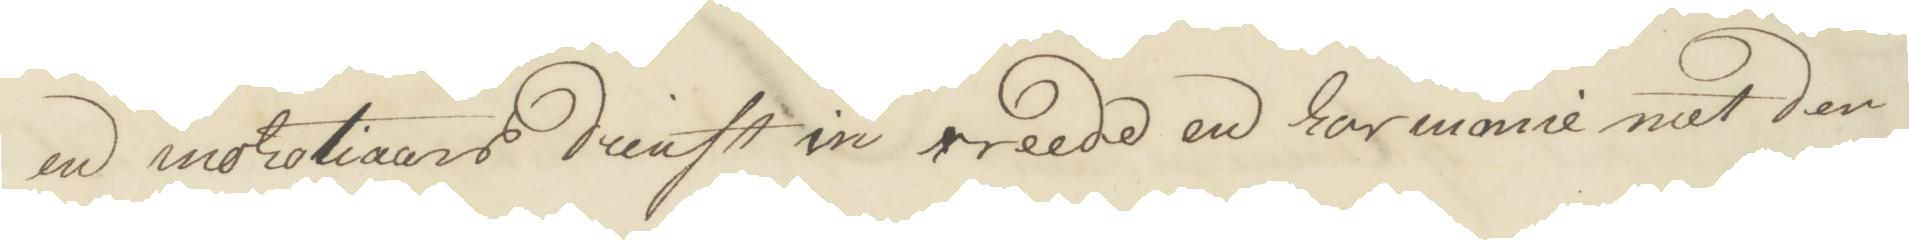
en mohotiaars dienst in vreede en harmonie met den
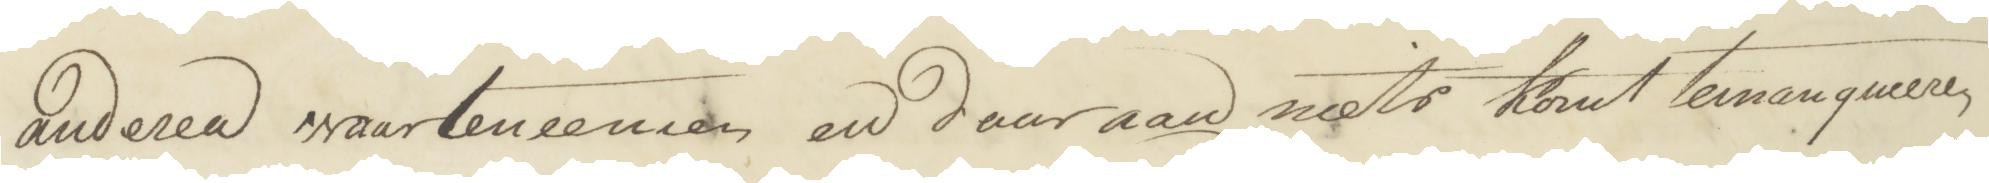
anderen waarteneemen en daar aan niets komt temanqueeren
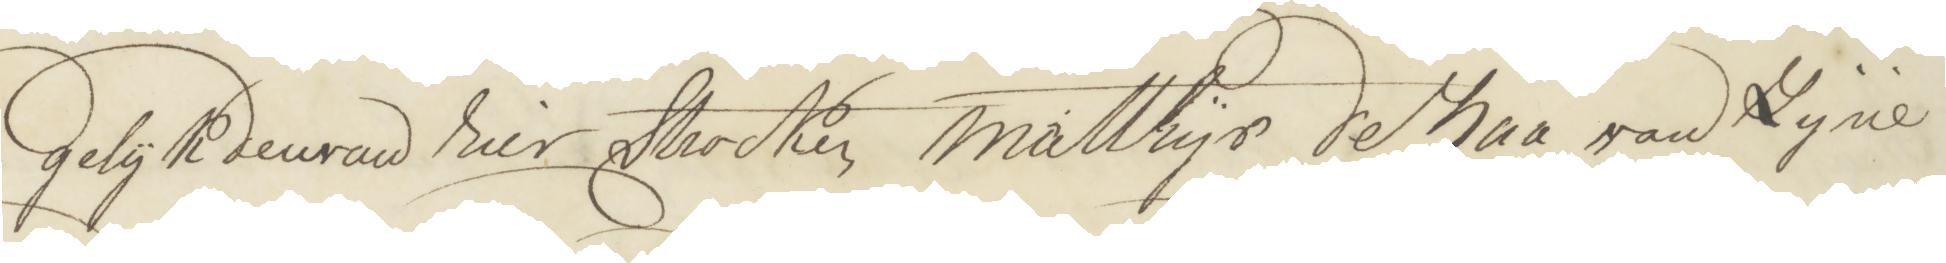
gelijk denraid hier vertrocken matthijs de Zaa van zijne
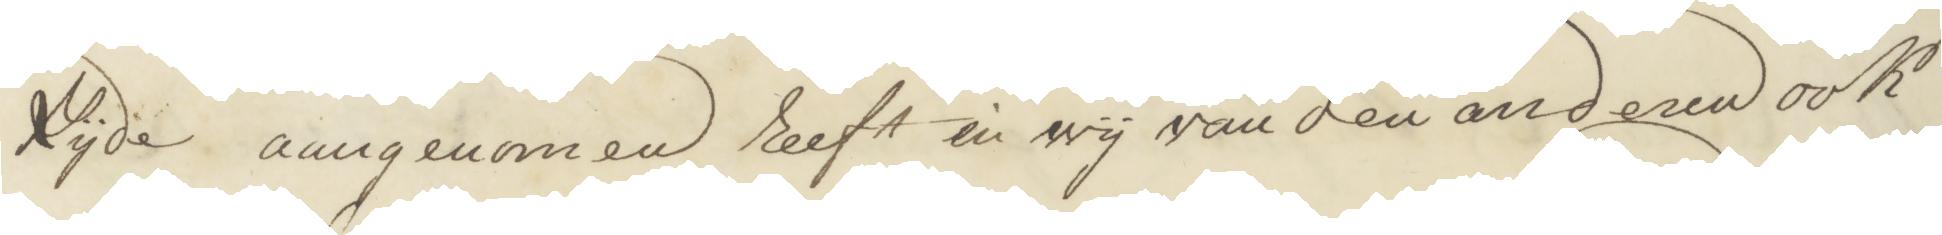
zijde aangenomen heeft en wij van den anderen ook
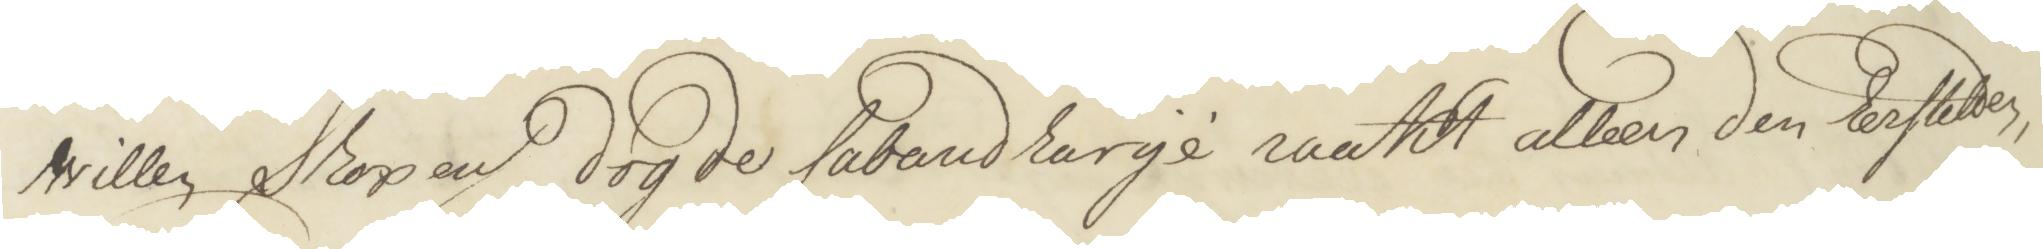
willen verhopen dog de saband harije raakt alleen den herstelden,
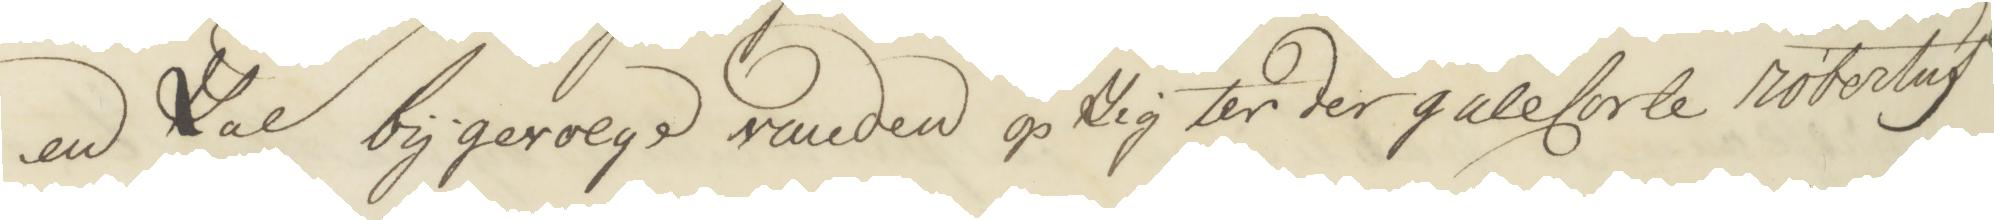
en zal bij gevolge vanden op zig ter der galecorte robertus
